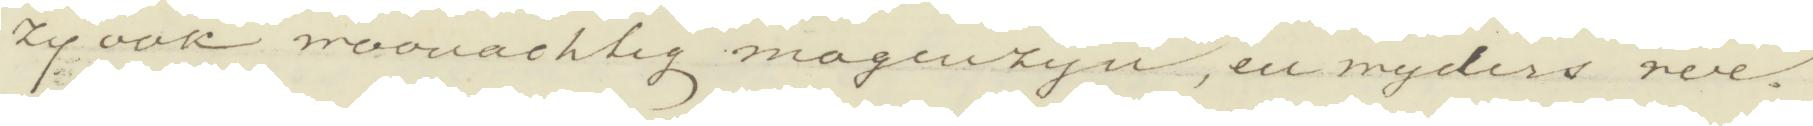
zy ook woonachtig mogen zyn, en wyders ver„
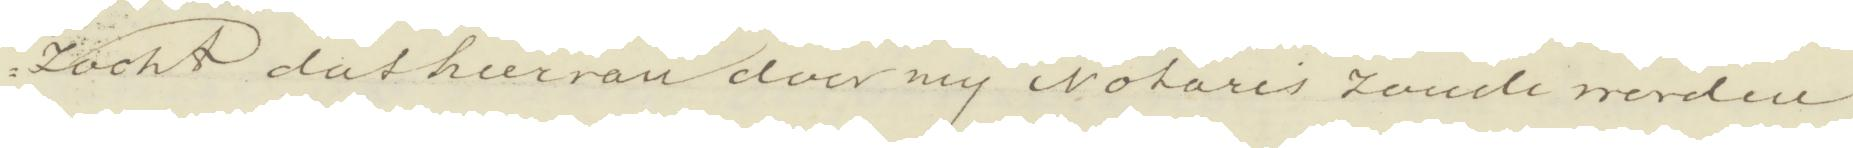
„zocht dat hiervan door my Notaris zoude werden
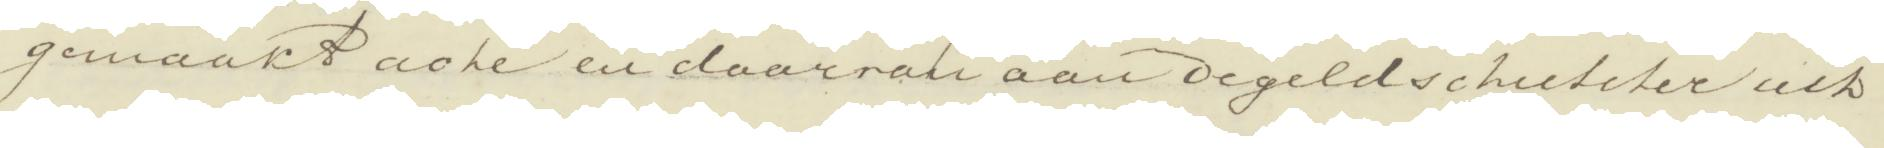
gemaakt acte en daarvan aan de geldschietster uit
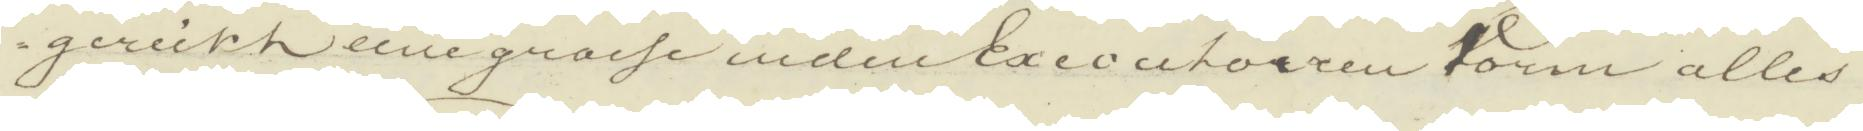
=gereikt eene grosse in den Executoiren Vorm alles
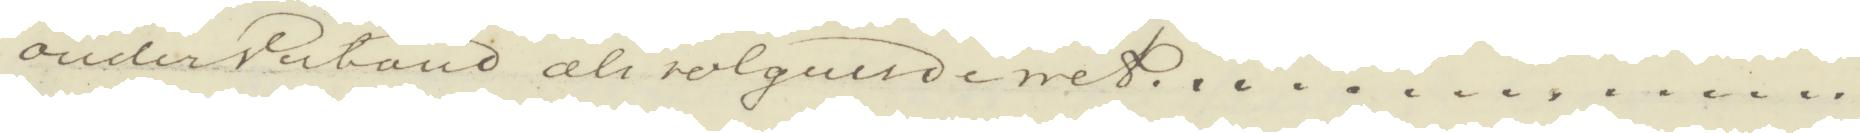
onder verband als volgens de wet. . . . . . . . . . . . . . .
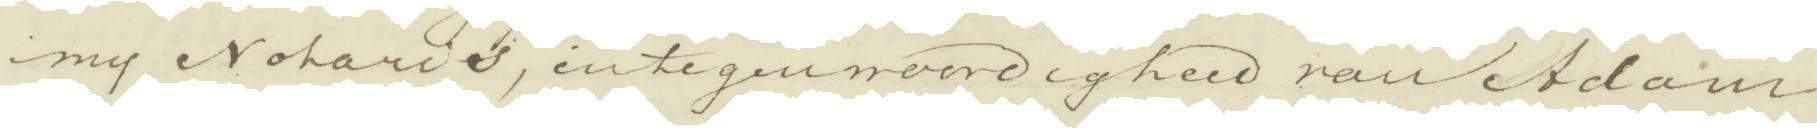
my Notaris, in tegenwoordigheid van Adam
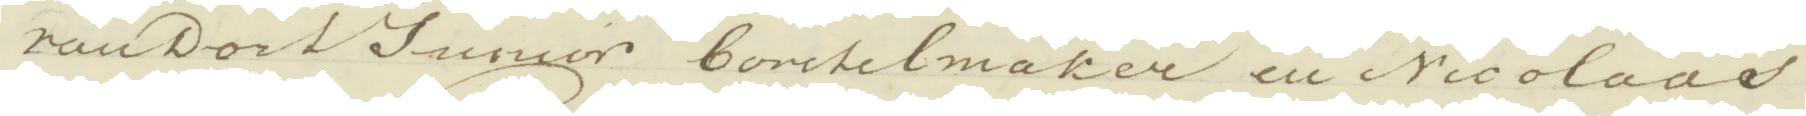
van Dort Iunior borstelmaker en Nicolaas
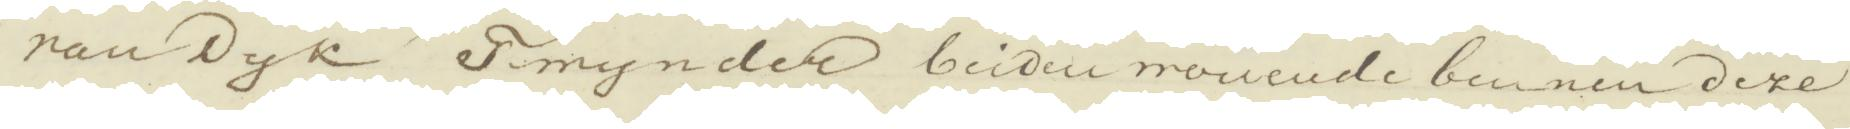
van Dyk Twynder beiden wonende binnen deze
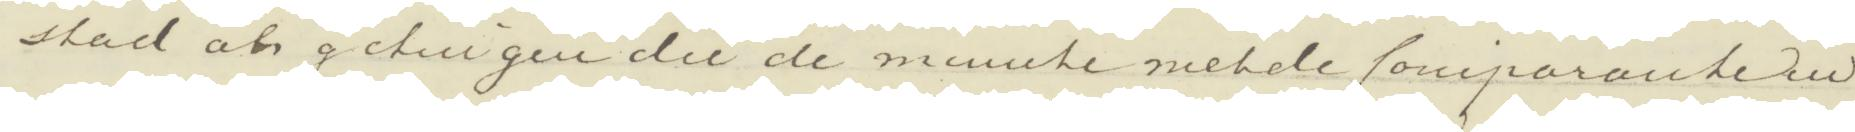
stad als getuigen die de minute met de Comparante en
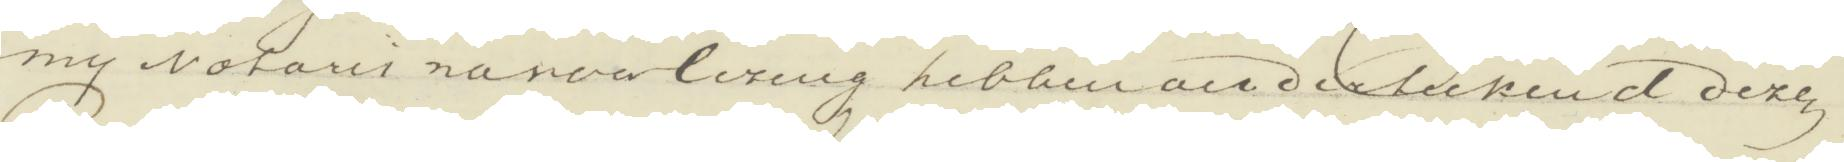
my Notaris na voorlezing hebben onderteekend dezen
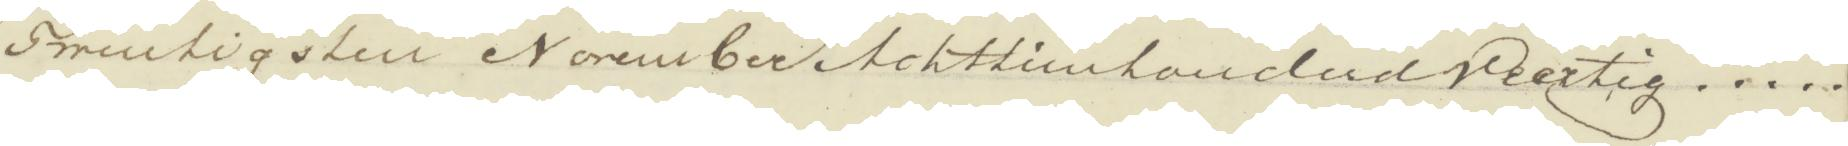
Twintigsten November Achttienhonderd veertig . . . . .
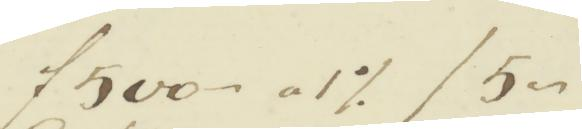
ƒ500-. a 1% / 5 -
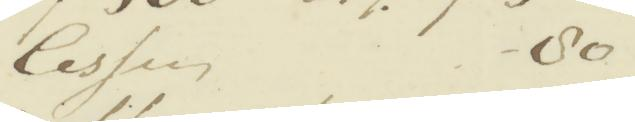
Cessien -80
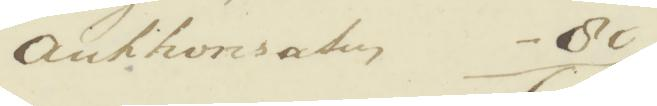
Authorisatien -80
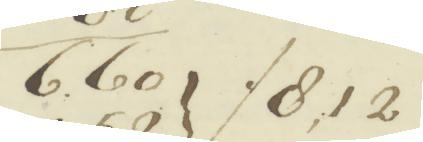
6. 60 ƒ8,12
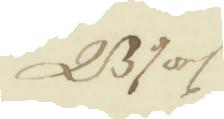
23%/
